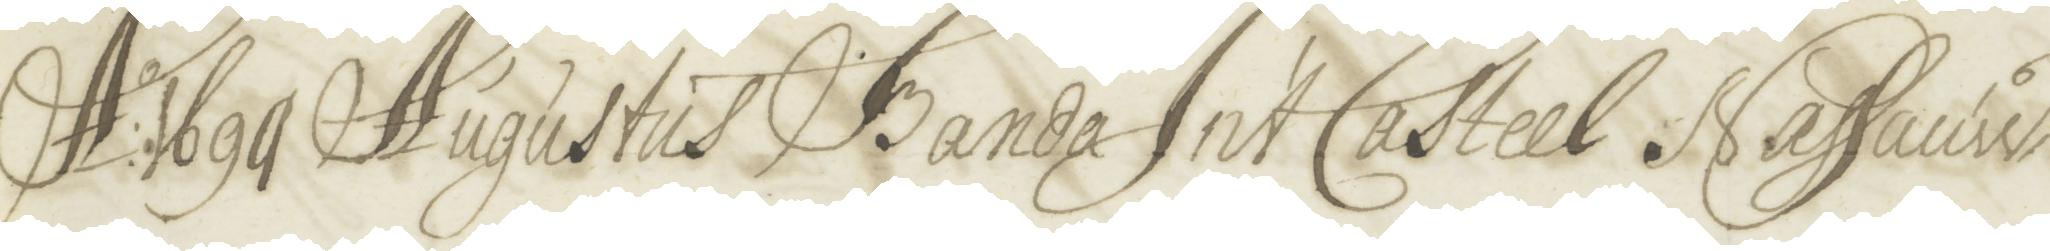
A:o 1694 Augustus Banda In't Casteel Nassauw,
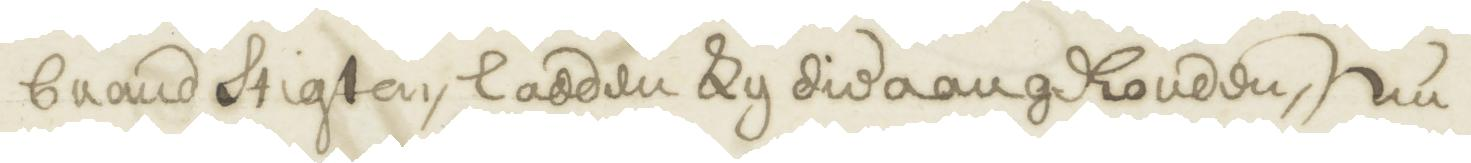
brand stigten, hadden zij die aangehouden, nu
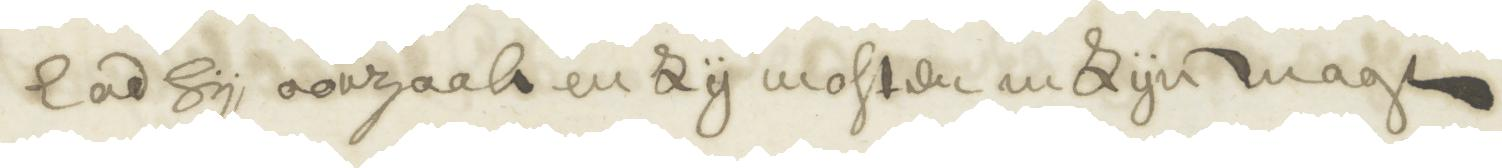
had hij oorzaak en zij mosten in zijn magt
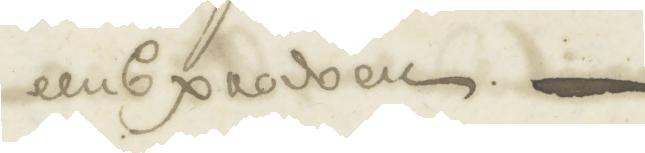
eens proeven. —
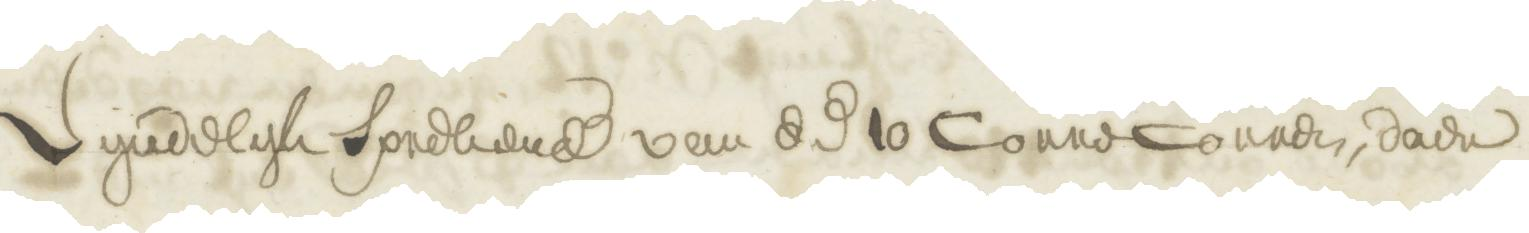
Eijndelijk sprekende van de 10 Correcorren, daer
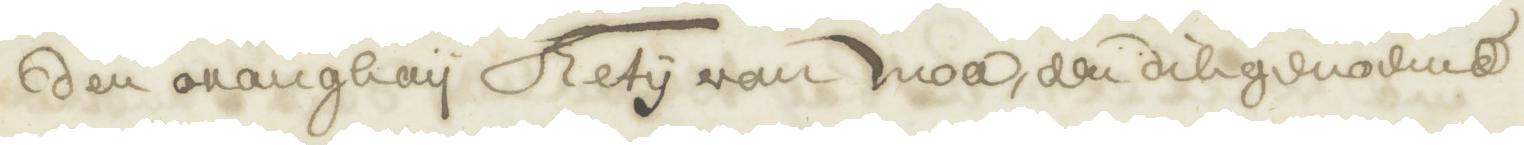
den orangkaij Ketij van moa, den dik genoemde
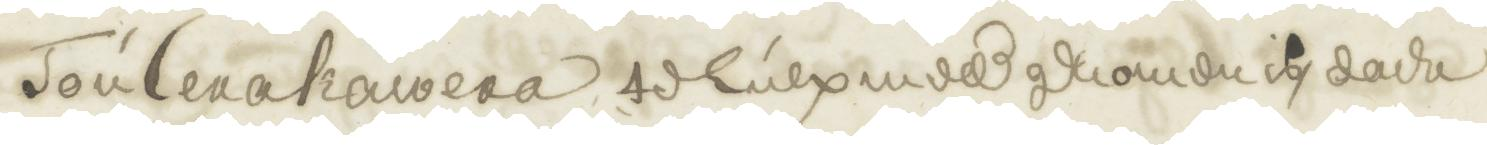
Touterakawera te hulp mede gekomen is daer
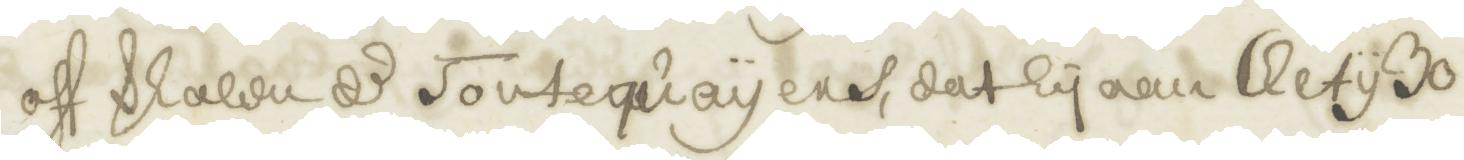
off verhalen de Toutequaijers, dat hij aan thetij 30
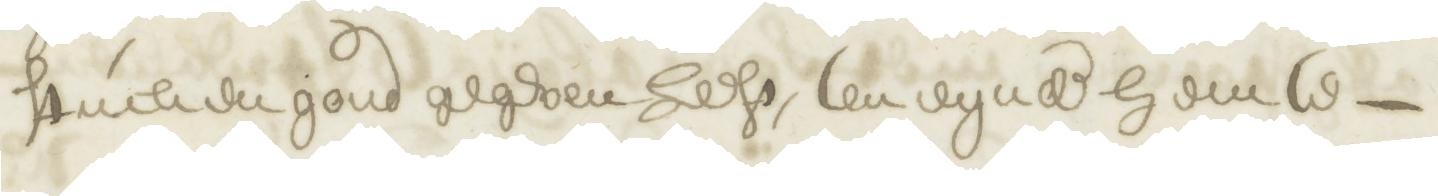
stucken goud gegeven heeft, ten eijnde hem te —
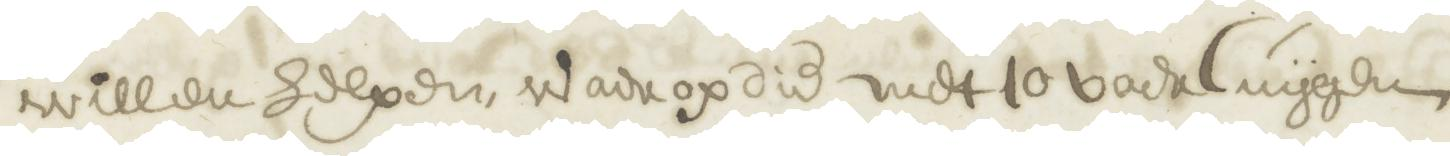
willen helpen, waer op die met 10 vaertuijgen
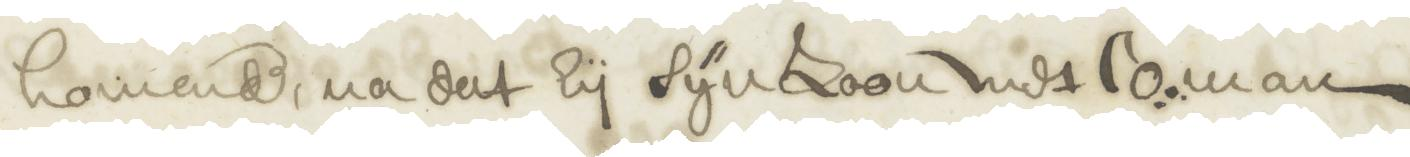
komende, na dat hij sijn zoon met 50. man
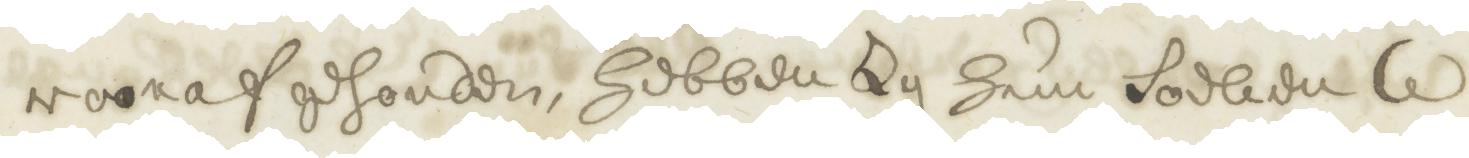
voor afgesonden, hebben zij hun soeken te
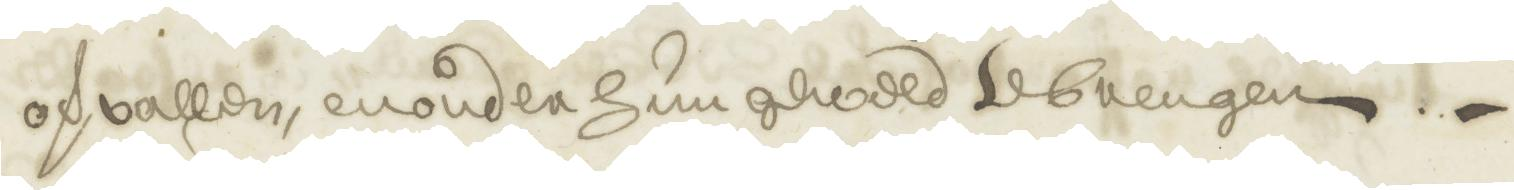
overvallen, en onder hun geweld te brengen. —
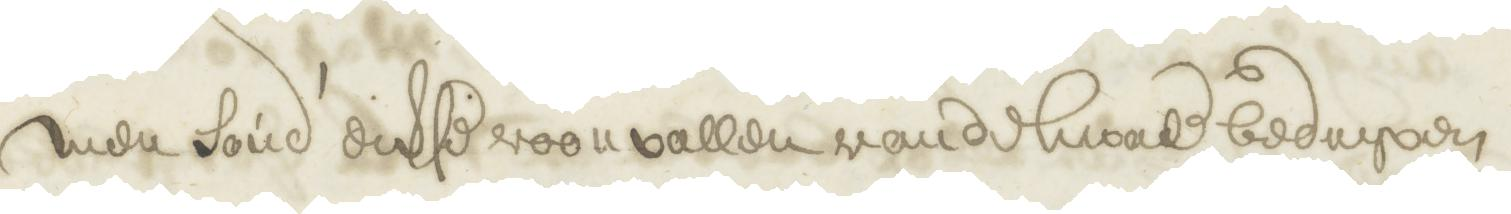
men soud' diverse voor vallen van de kwade bedryven
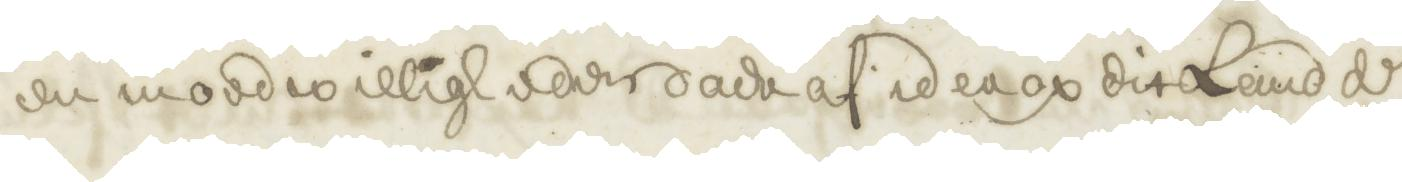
en moedwilligheden daer af ider op dit Land de
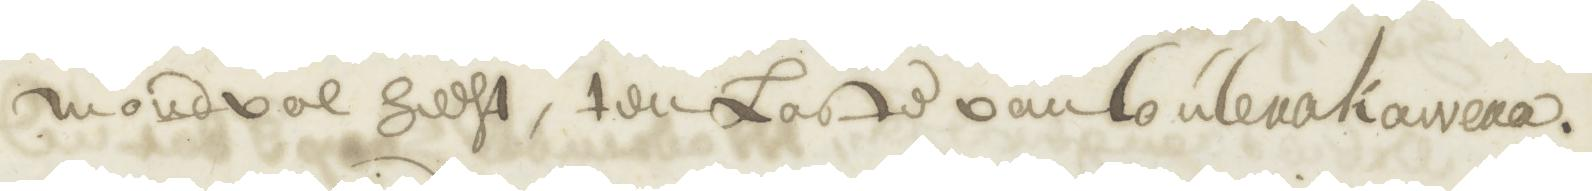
mondvol heeft, ten Laste vantouterakawera.
